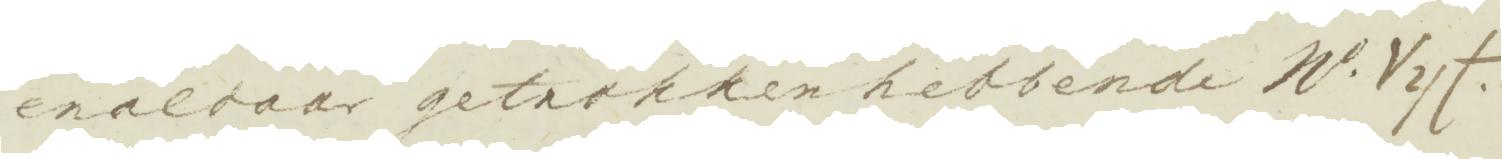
en aldaar getrokken hebbende N.o Vijf.
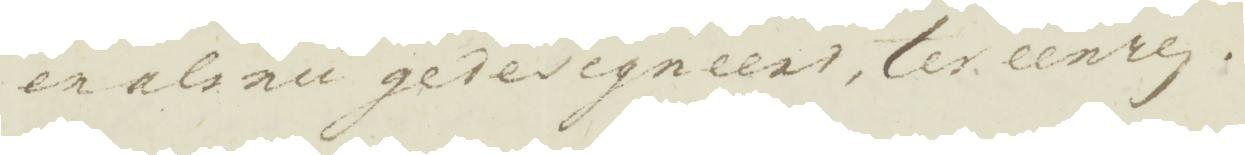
en als nu gedesigneert, ter eenre.
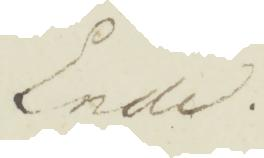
Ende.
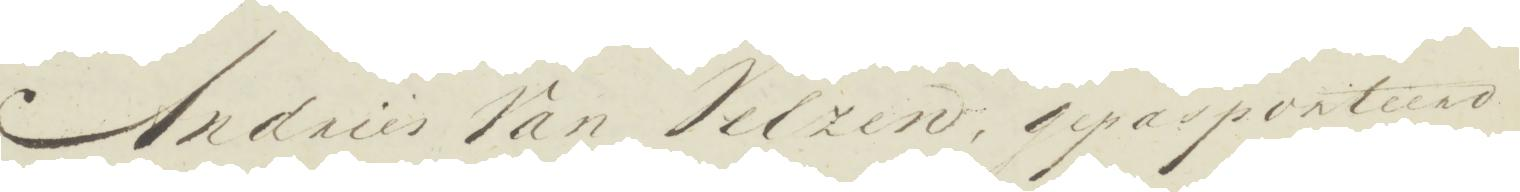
Andries van Velzen, gepasporteerd
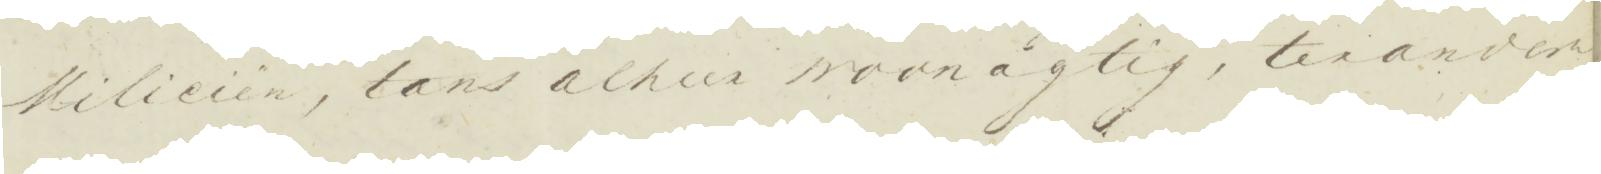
Miliciën, tans alhier woonagtig, ter andere
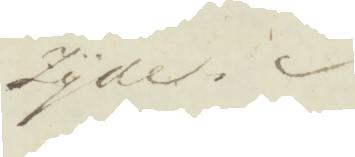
zijde,
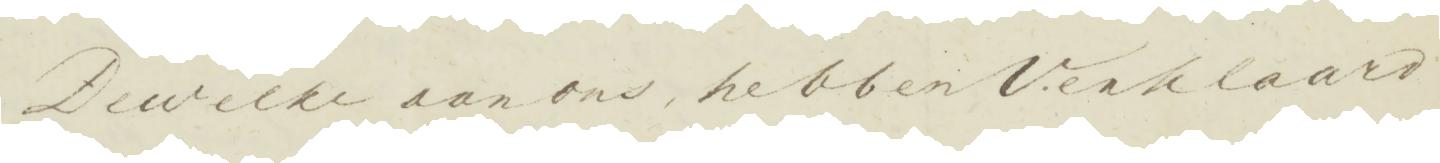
Dewelke aan ons, hebben Verklaard
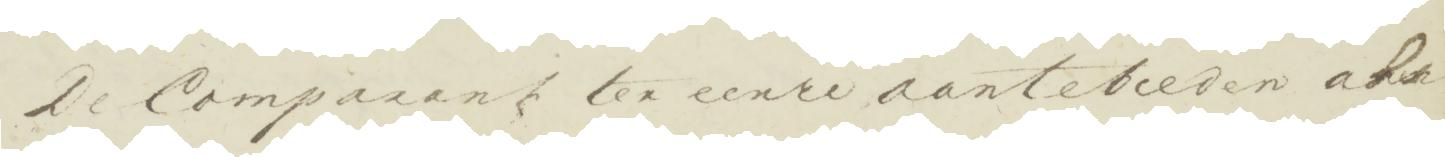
De Comparent ter eenre aante bieden als
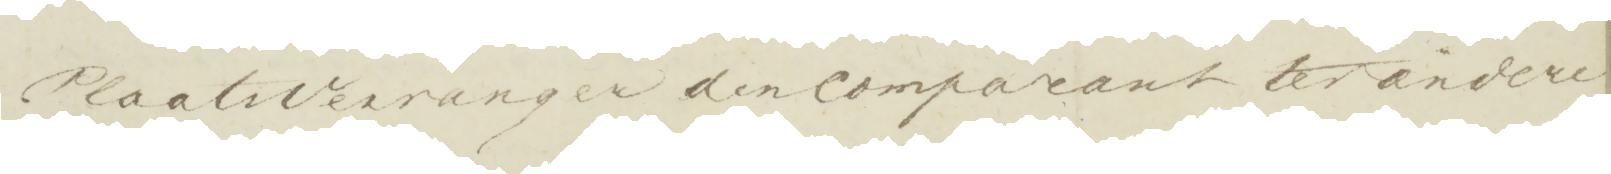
Plaatsvervanger den comparant ter andere
